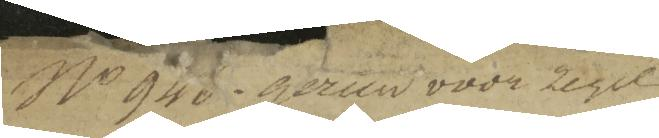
No 946 - gezien voor zegel
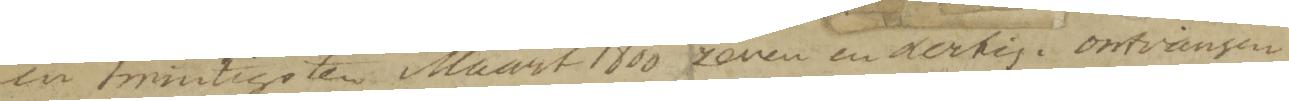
en twintigsten Maart 1880 zeven en dertig. ontvangen
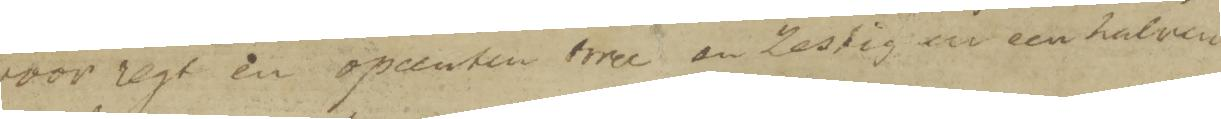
voor regt en opcenten twee en zestig en een halven
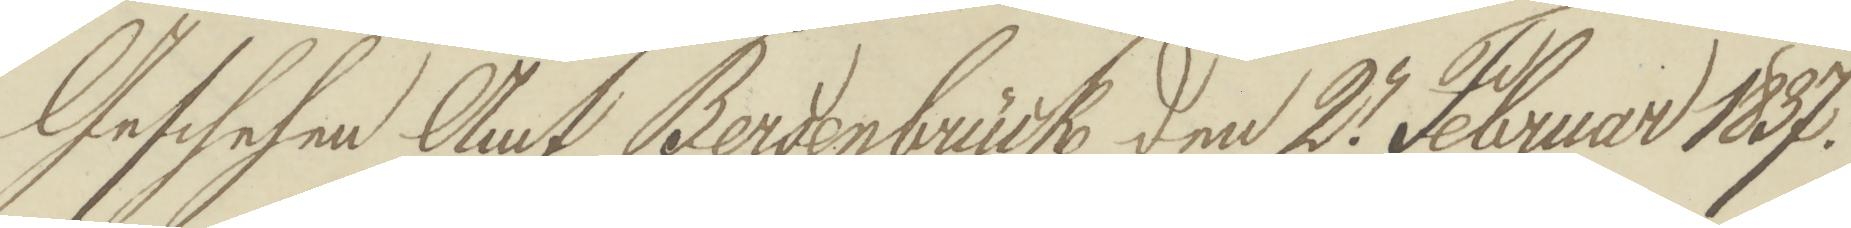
Geschehen Amt Bersenbruck den 2.' Februar 1837.
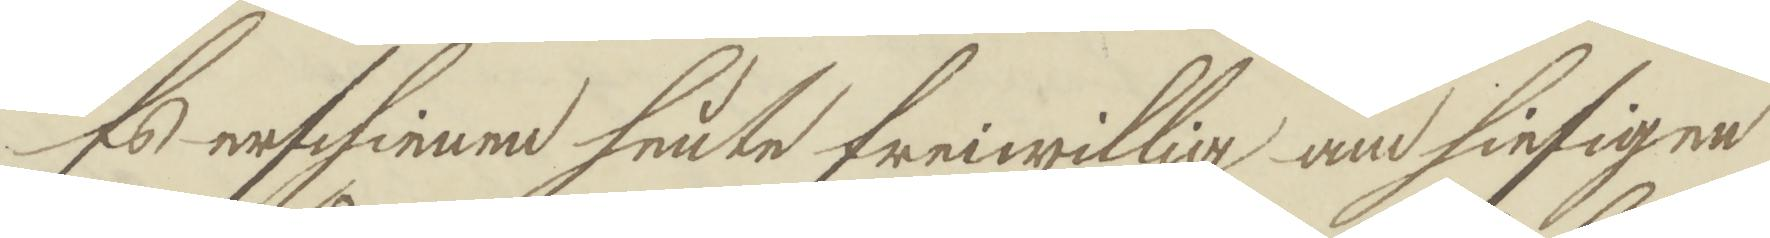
Es erschienen heute freiwillig am hiesigen
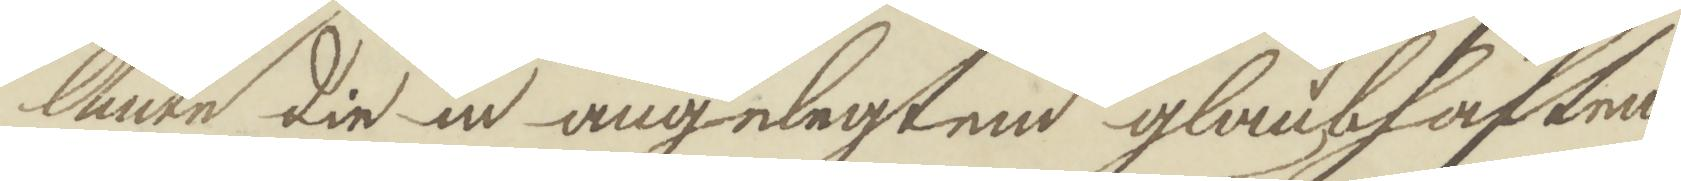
Amte die in angelegten glaubhaften
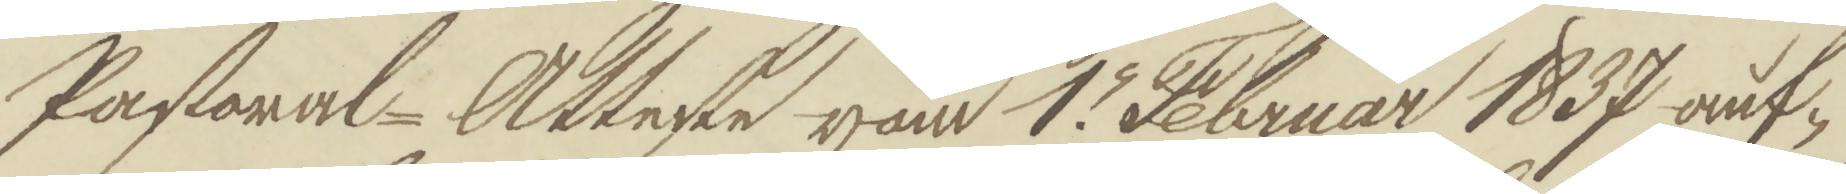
Pastoral=Atteste vom 1:' Februar 1837 auf„
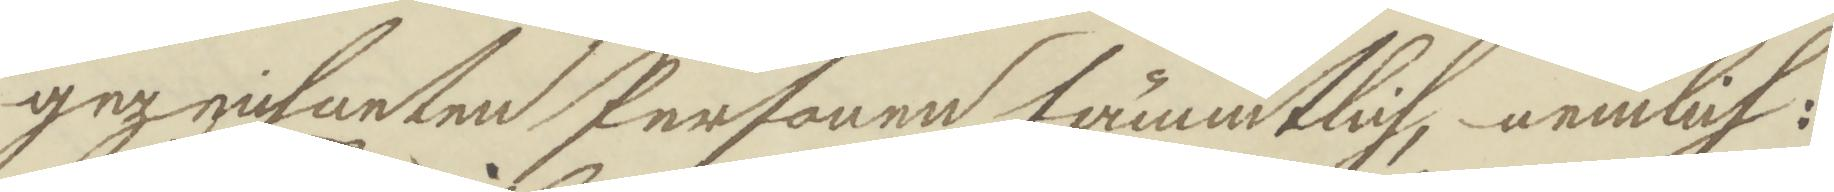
geziehenten Personen sämmtlich, nemlich:
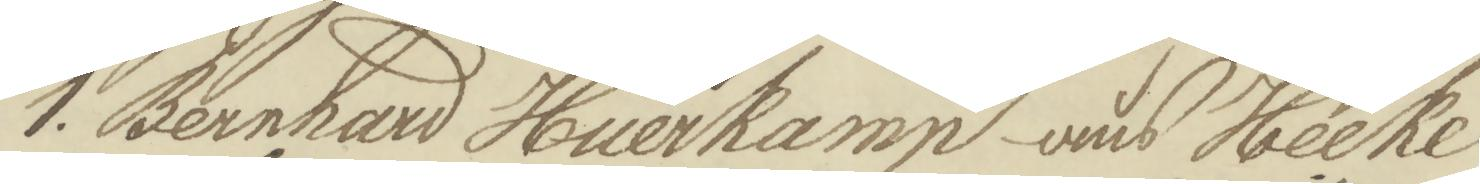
1. Bernhard Huerkamp aus Heeke
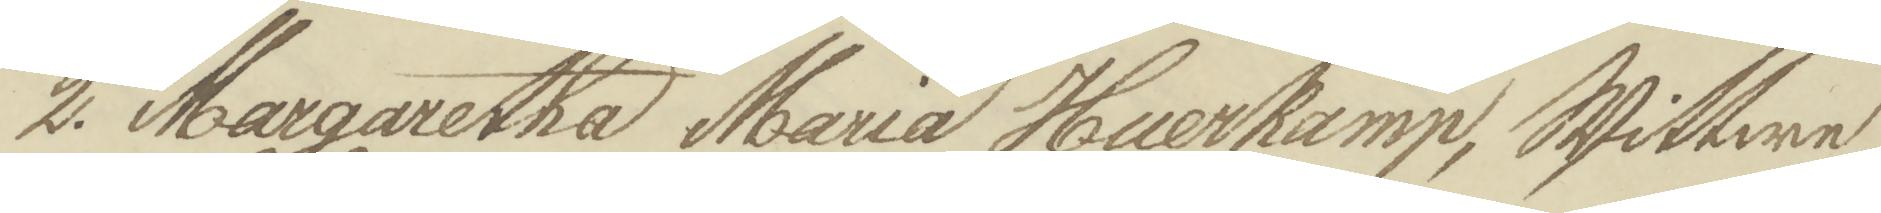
2. Margaretha Maria Huerkamp, Wittwe
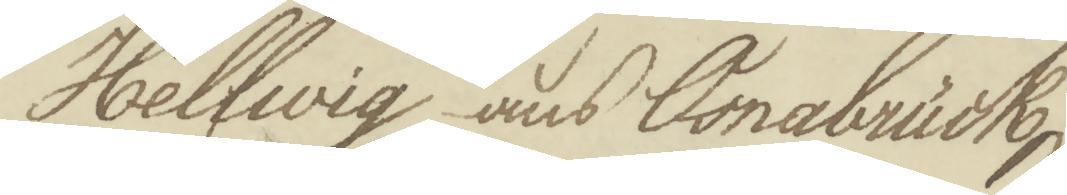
Hellwig aus Osnabrück
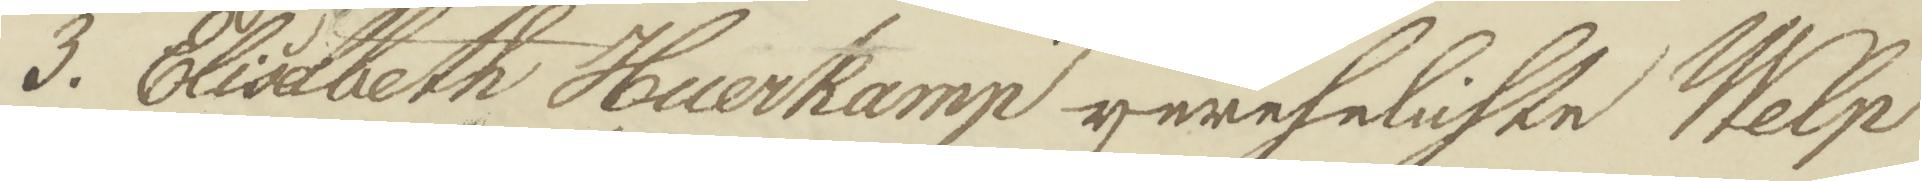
3. Elisabeth Huerkamp verehelichte Welp
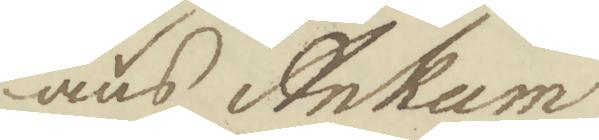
aus Ankum
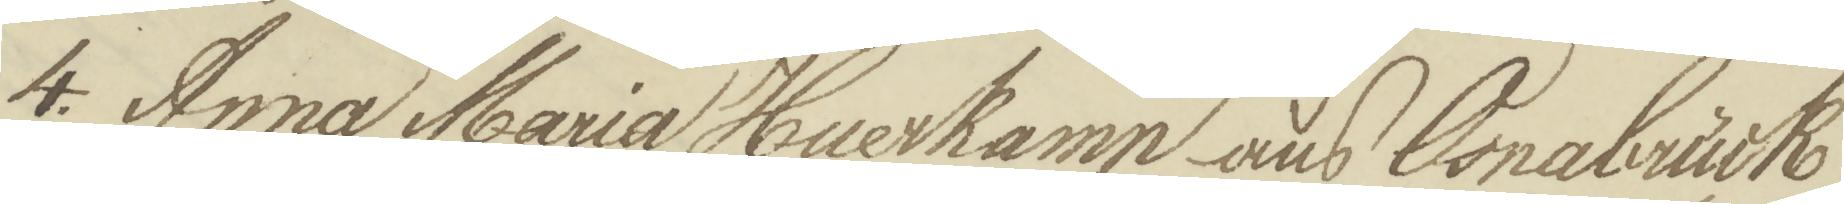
4. Anna Maria Huerkamp aus Osnabrück
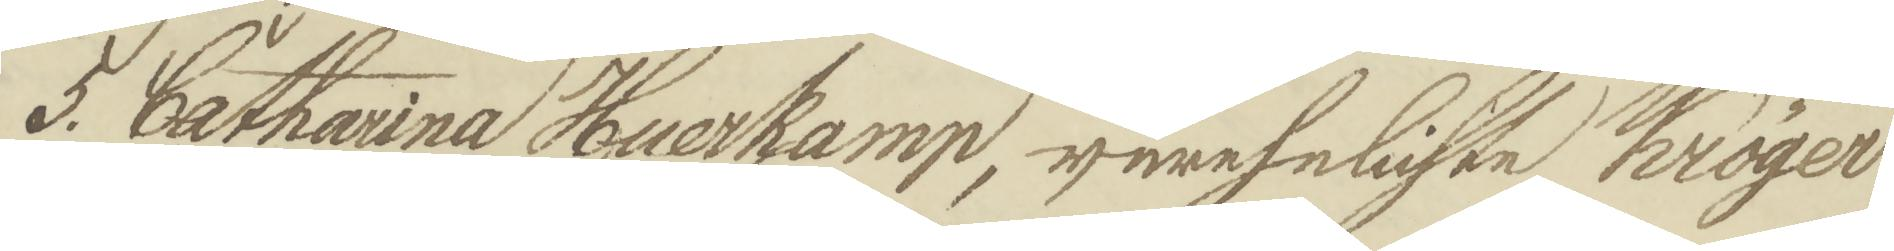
5. Catharina Huerkamp, verehelichte Kröger
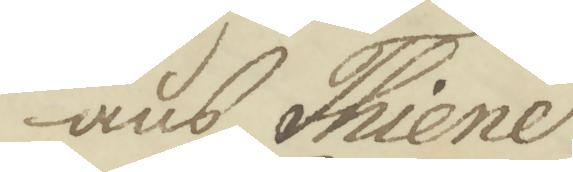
aus Thiene
